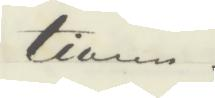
tiaren
